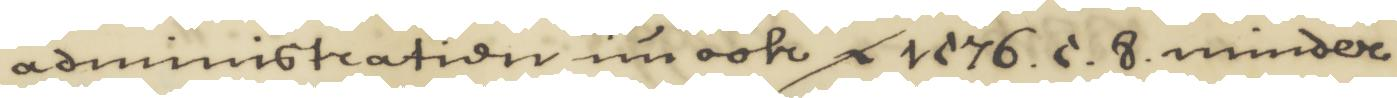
administratien nu ook ƒ 1576.5.8. minder
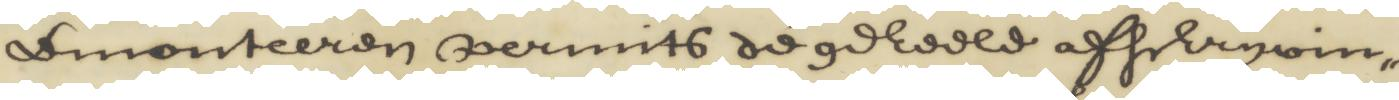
temonteeren permits de geheele afschrijvin„
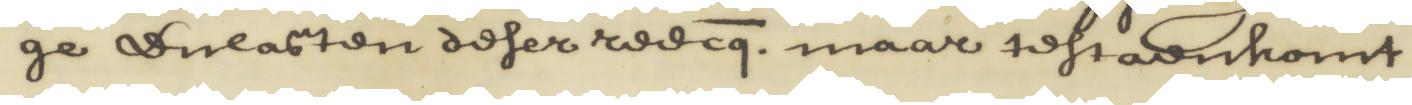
ge tenlasten deser reecq. maar te staenkomt
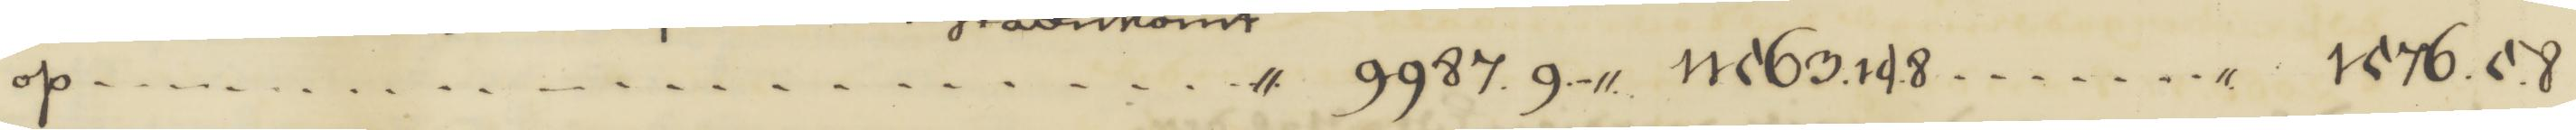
op . . . . . . . . . . . . . . . . . . . . . . . „ 9987.9.-„. 11563.14.8 . . . . . . . „ 1576.5.8
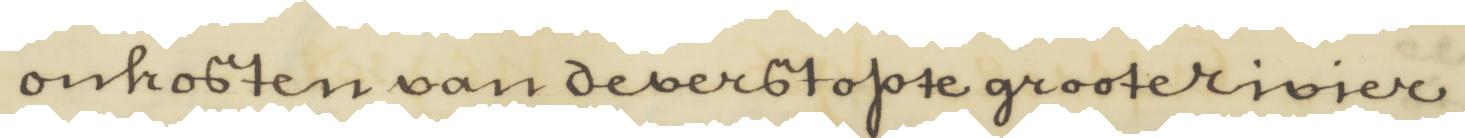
onkosten van de verstopte groote rivier
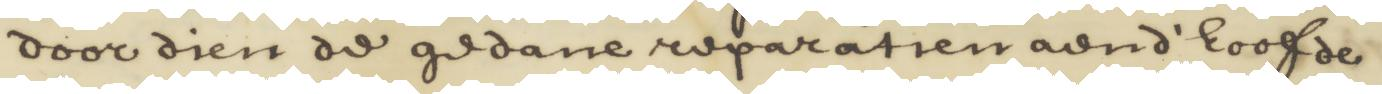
door dien de gedane reparatien aen d' hoofde
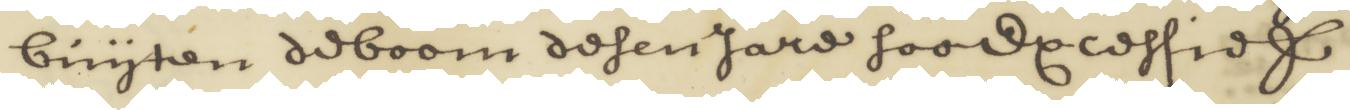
buijten deboom desen Jare soo Excessief
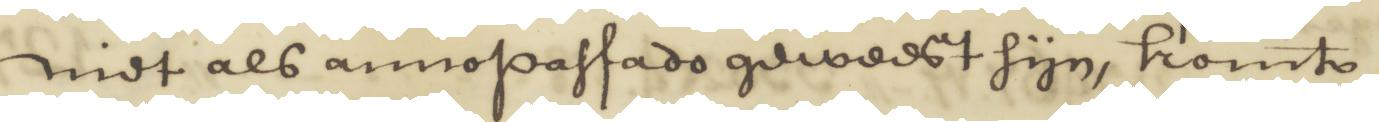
niet als anno passado geweest sijn, komt
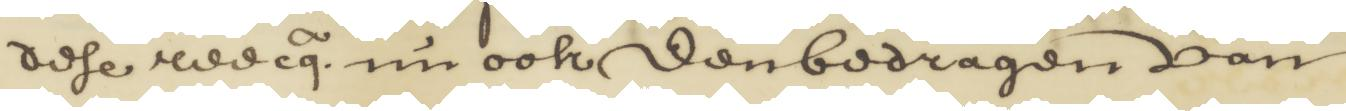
dese reecq. nu ook Een bedragen van
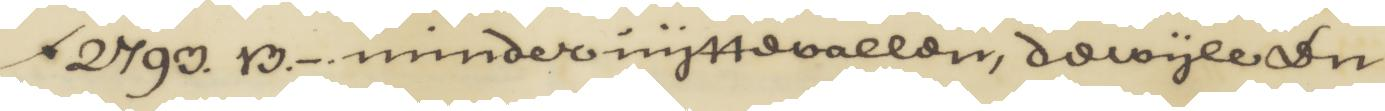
ƒ 2793. 13.-. minder uijttevallen, dewijle ten
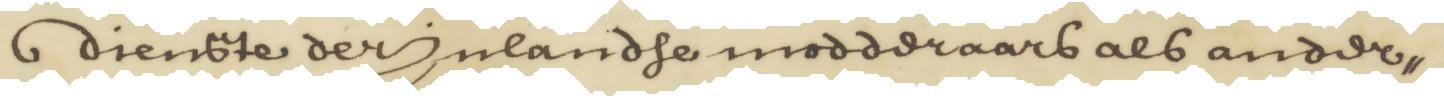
dienste der inlandse modderaars als ander„
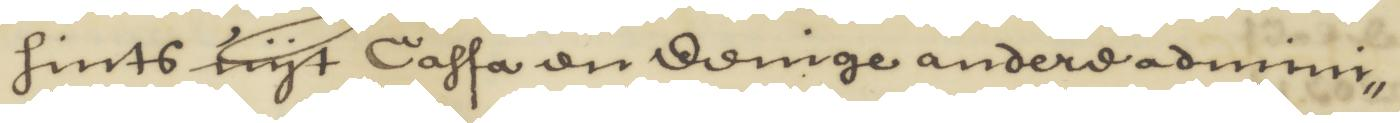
sints uijt Cassa en Eenige andere admini„
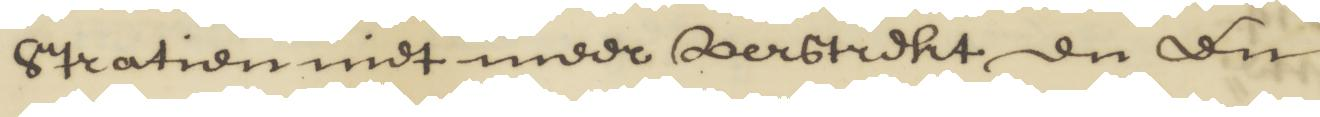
stratien niet meer verstrekt en ten
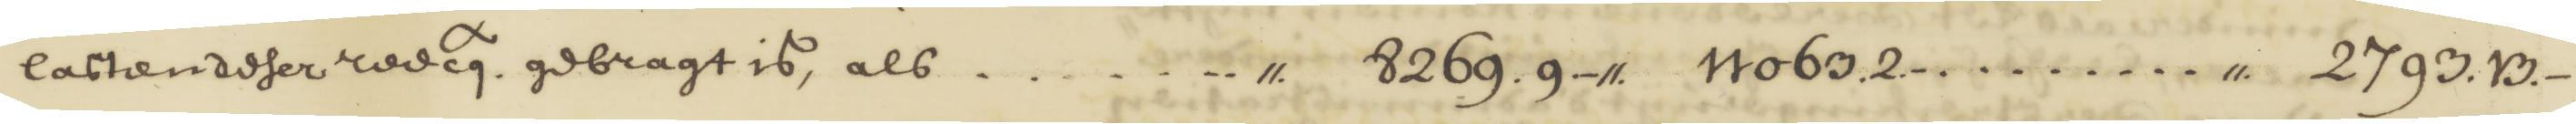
lasten deser reecq. gebragt is, als . . . . . . . „ 8269.9.-„. 11063.2.- . . . . . . . . „ 2793.13.-
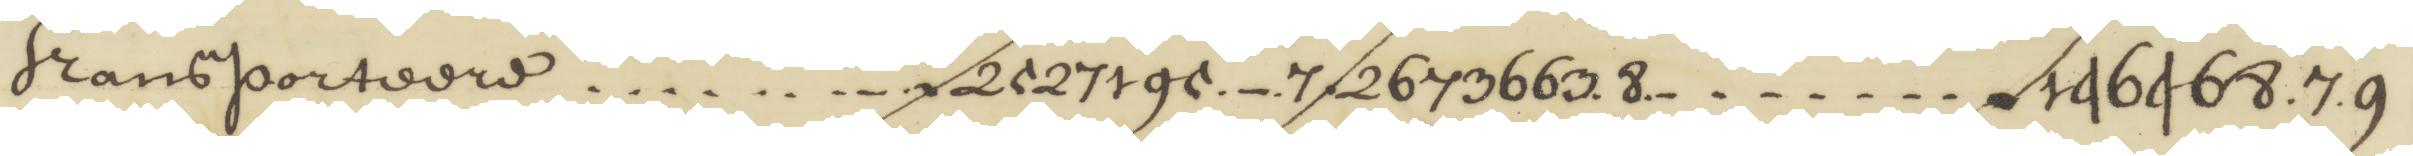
Transporteere . . . . . . . . ƒ2527195.-.7ƒ2673663.8.- - - - - - - ƒ146468.7.9
